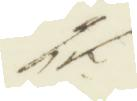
zk
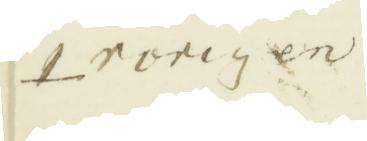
¶ vorig en
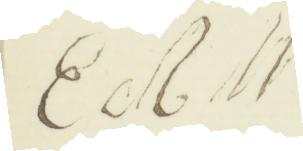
EAW
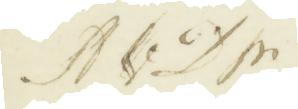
A v.D j=r
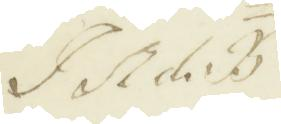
J A d. B
